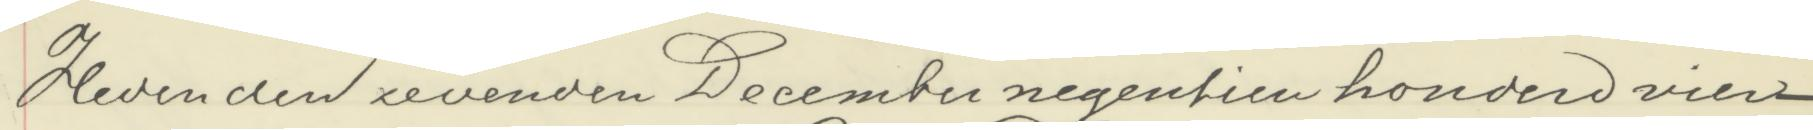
Heden den zevenden December negentien honderd vier
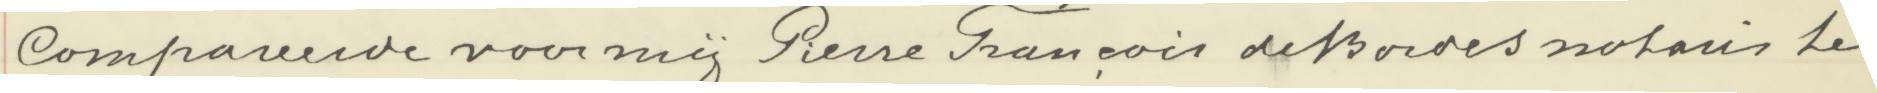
Compareerde voor mij Pierre François de Bordes notaris te
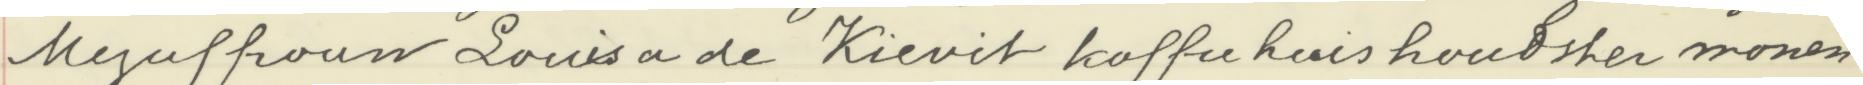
Mejuffrouw Louisa de Kievit koffiehuishoudster wonen
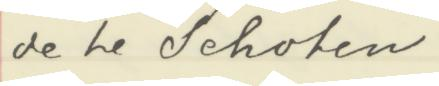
de te Schoten
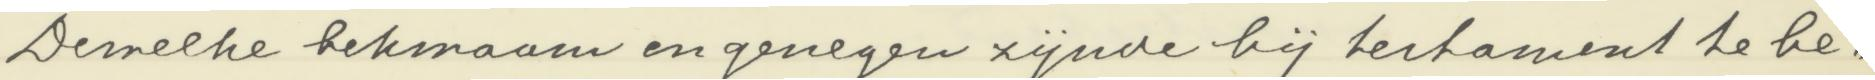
Dewelke bekwaam en genegen zijnde bij testament te be„
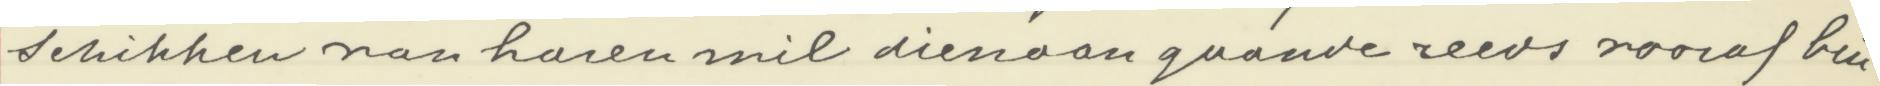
schikken van haren wil dienaangaande reeds vooraf bui
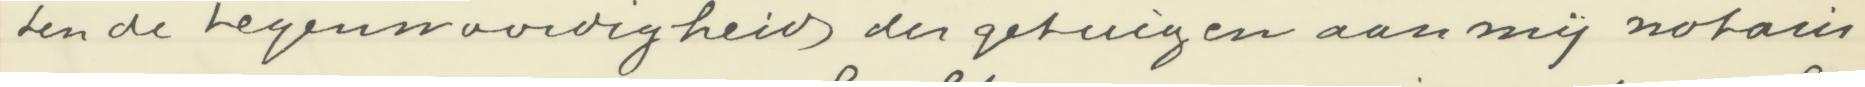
ten de tegenwoordigheid der getuigen aan mij notaris
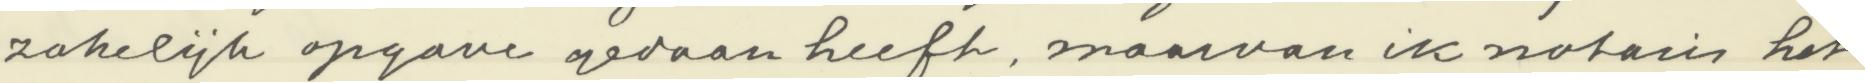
zakelijk opgave gedaan heeft, waarvan ik notaris het
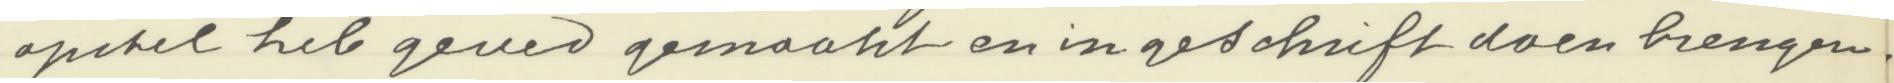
opstel heb gereed gemaakt en in geschrift doen brengen
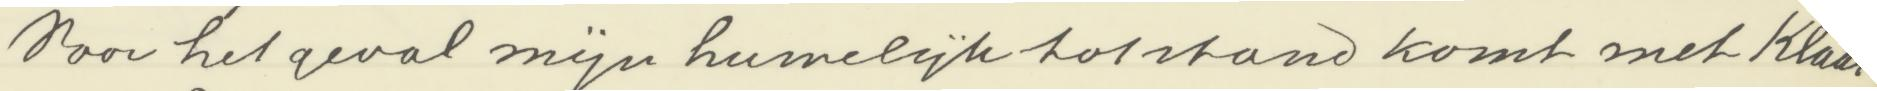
Voor het geval mijn huwelijk tot stand komt met Klaas
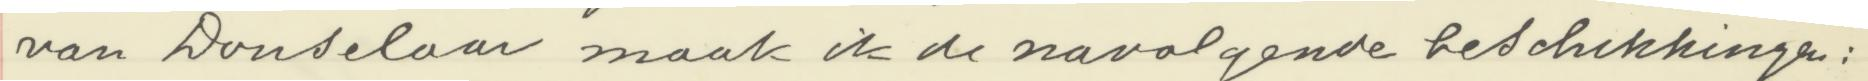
van Donselaar maak ik de navolgende beschikkingen:
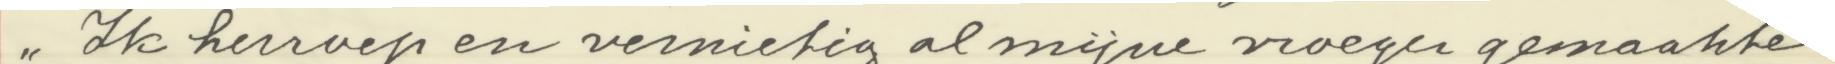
„ Ik herroep en vernietig al mijne vroeger gemaakte
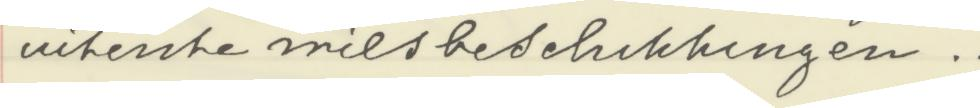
uiterste wilsbeschikkingen.
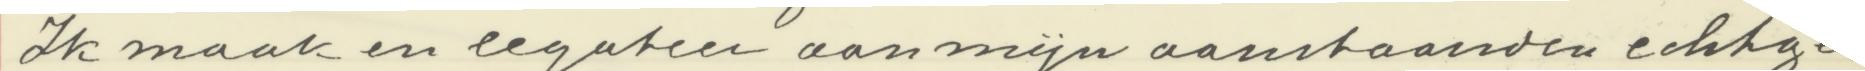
Ik maak en legateer aan mijn aanstaanden echtge„
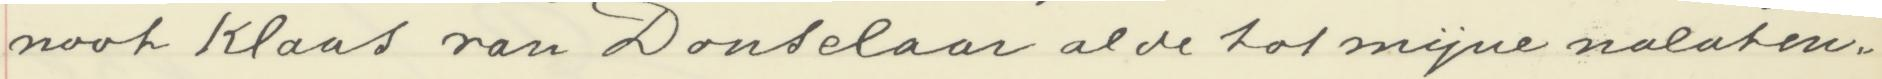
noot Klaas van Donselaar al de tot mijne nalaten„
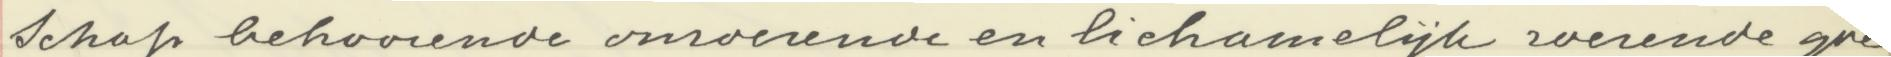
schap behoorende onroerende en lichamelijk roerende goe
